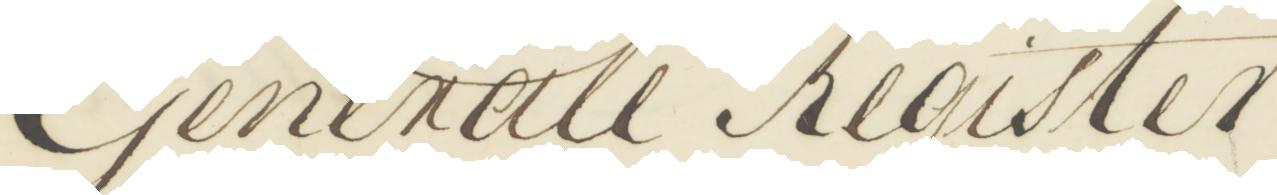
Generale Register
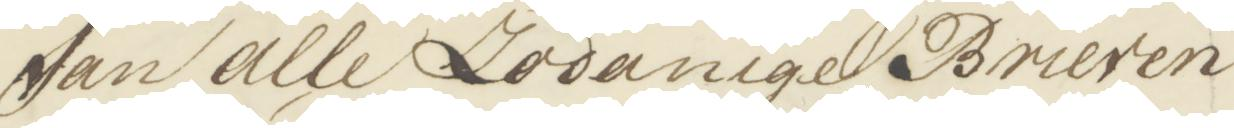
van alle zodanige Brieven
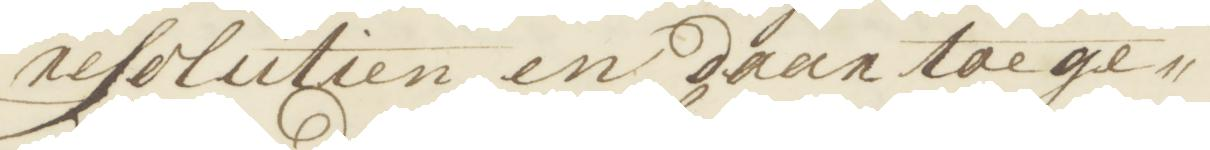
resolutien en daar toege„
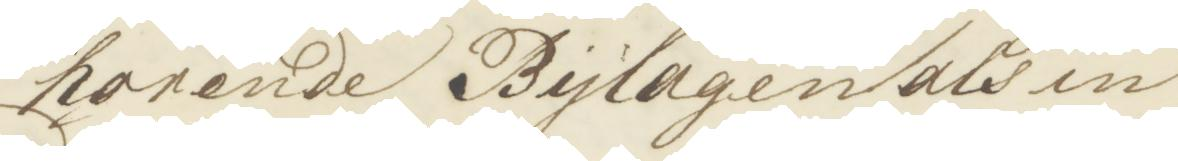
horende Bijlagen als in
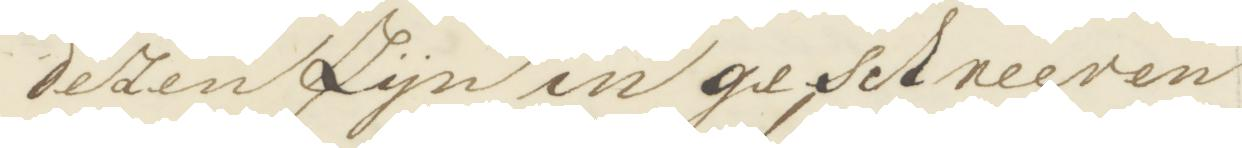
dezen zijn in geschreeven
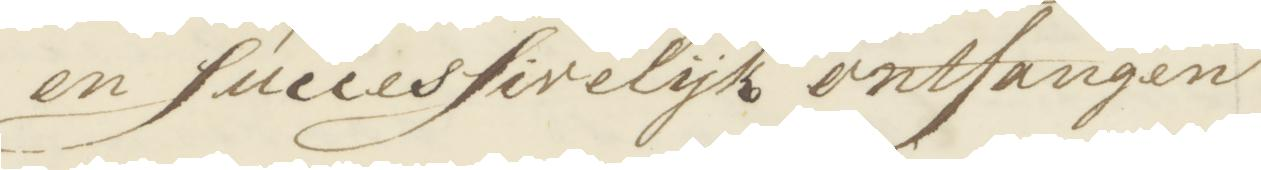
en successivelijk ontfangen
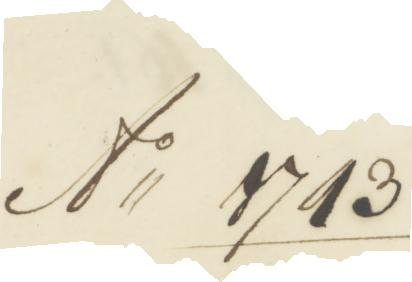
A„o 1743
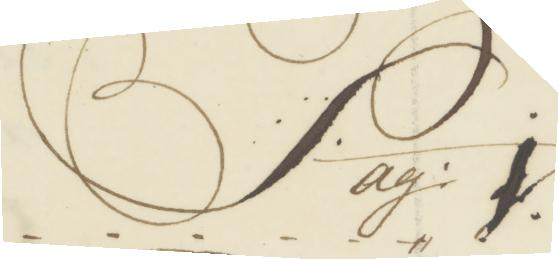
Pag: 1.
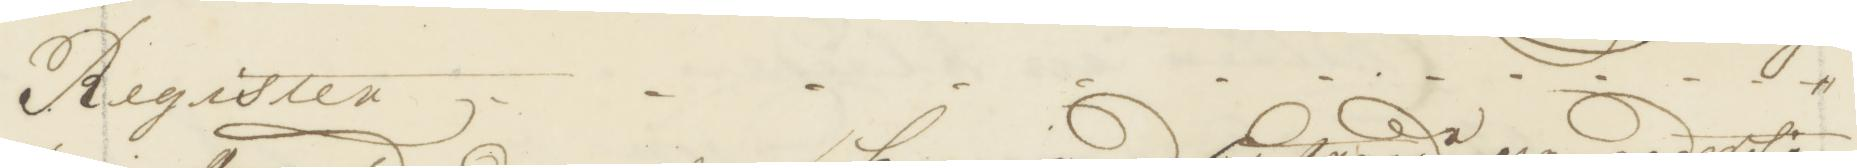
Register - - - - - - - - - - - - -„
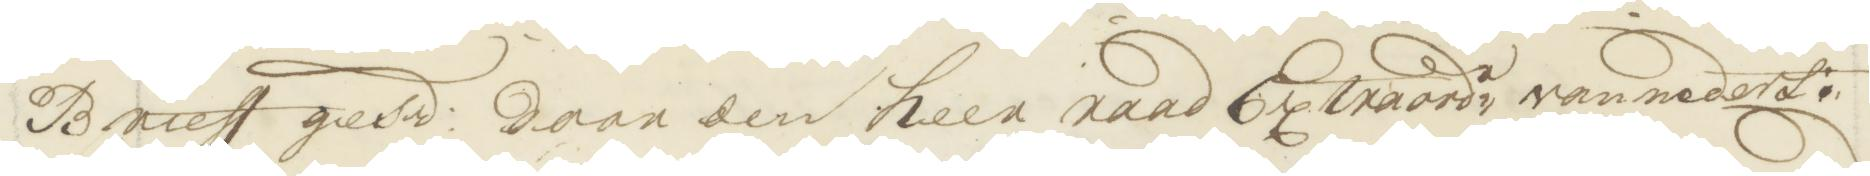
Brieft gesr: door den heer raad Extroord„r van nederl„t
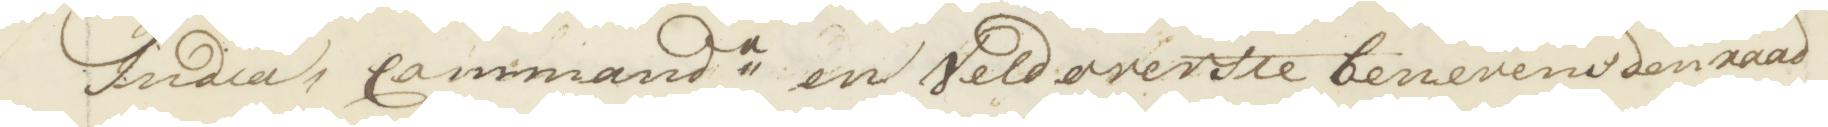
India, Command„r en veldoverste benevens den raad
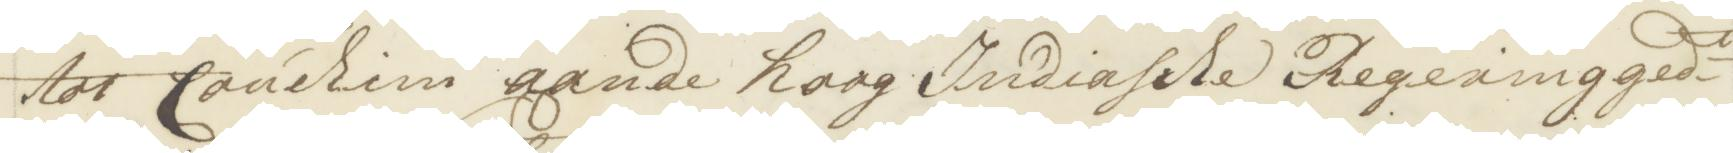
tot Couchim aan de hoog Jndiasche Regering ged=t
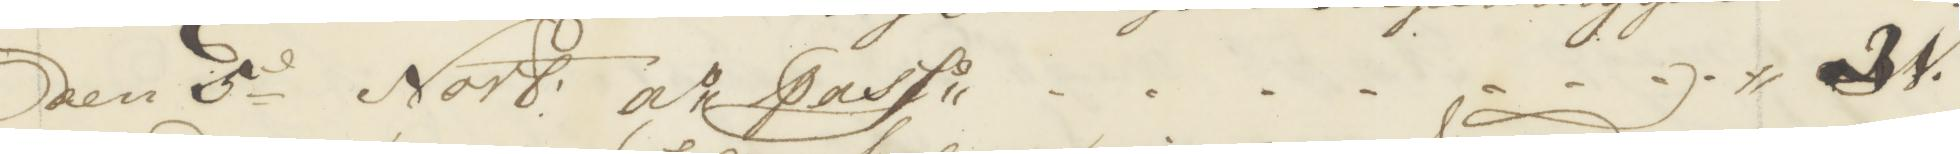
den 5=e Novb' a„o Pass„o - - - - - - - - „ 31.
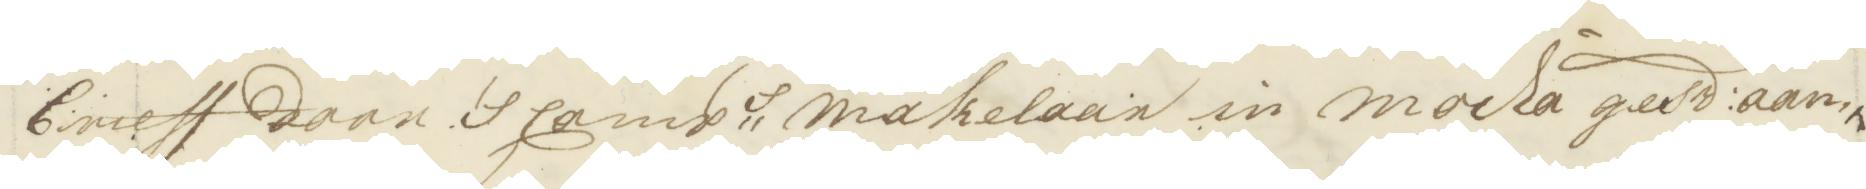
brieff door ’s comp„s makelaar in mocha gesr: aan„
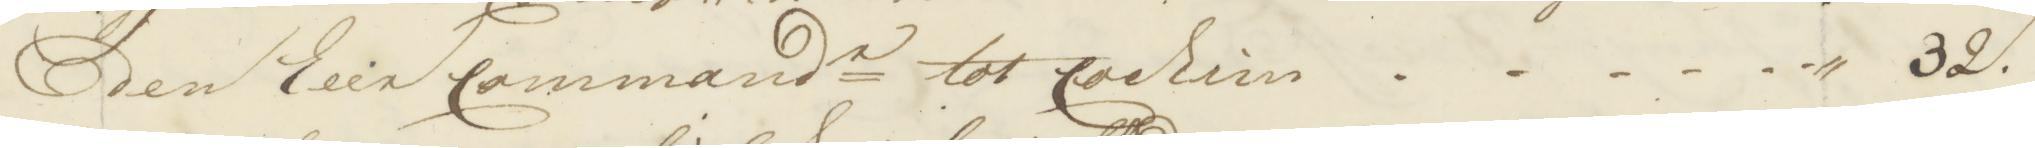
den heer Command=r tot Cochim - - - - - -„ 32.
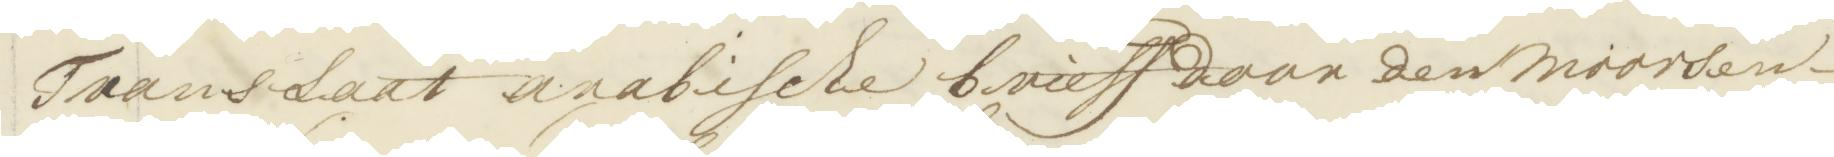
Translaat arabische brieff door den moorsen-
